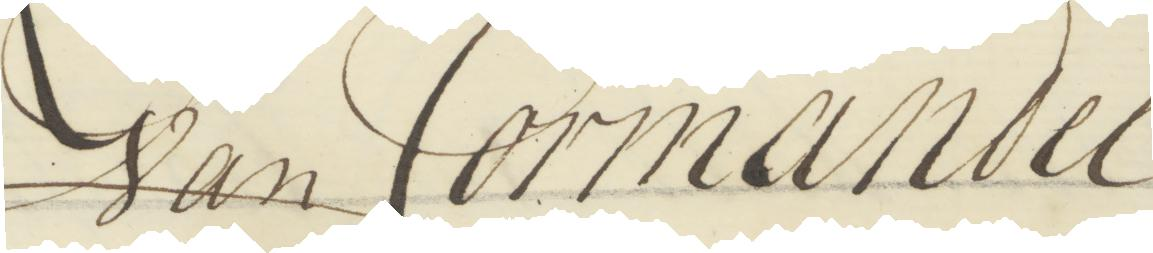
Van Cormandel
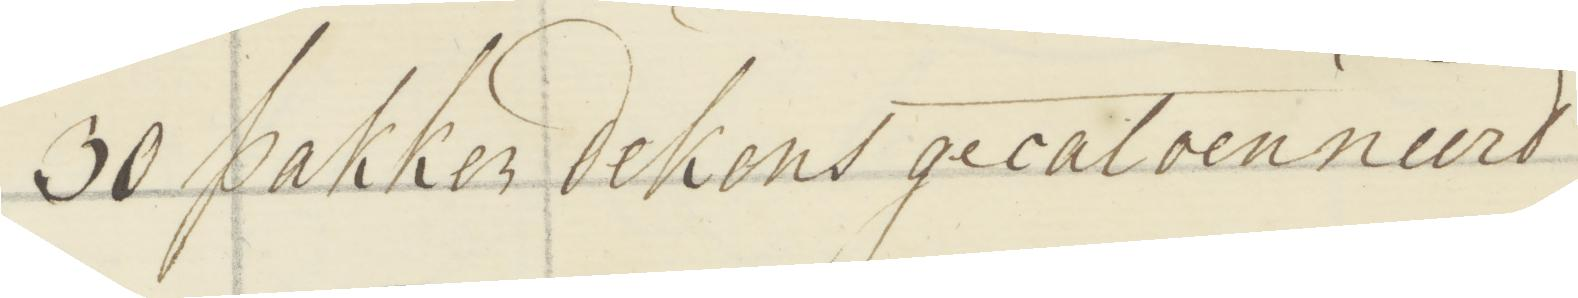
30 pakken dekens gecatoenneerd
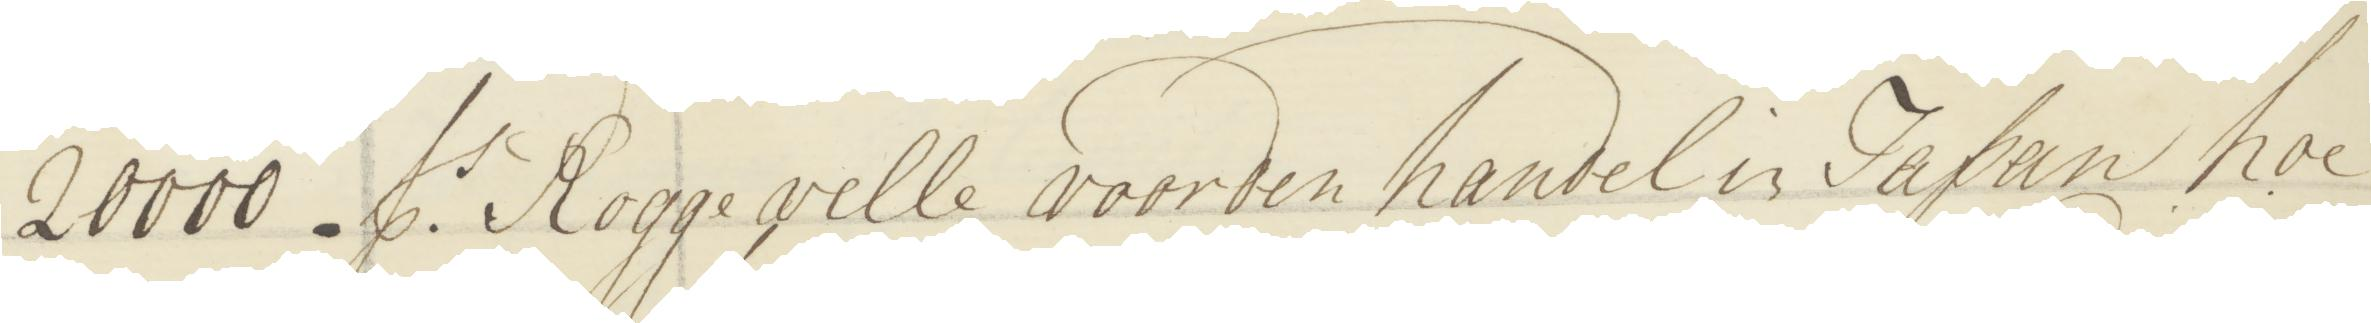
20000 — p.s Rogge velle voor den handel in Iapan hoe
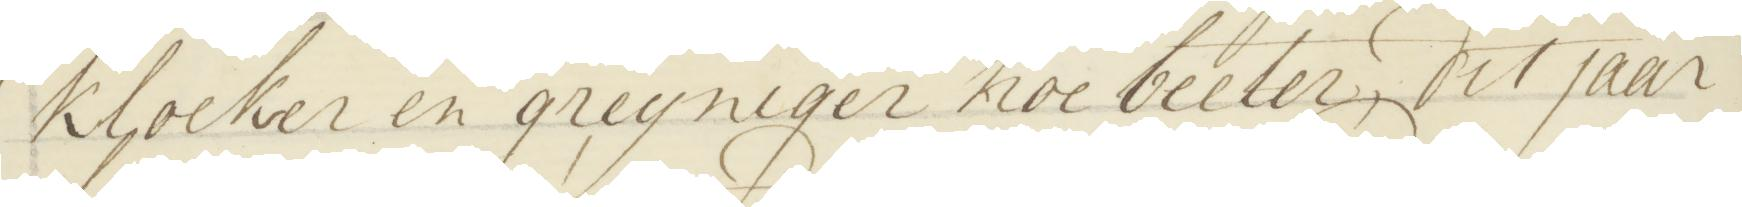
kloeker en greyniger hoe beeter, dit jaar
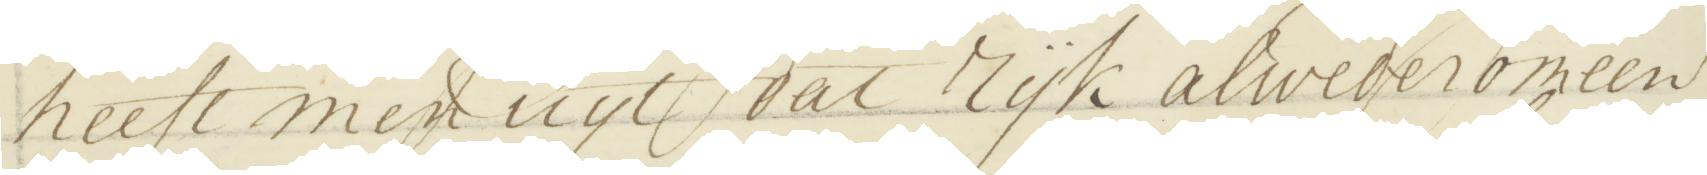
heeft men uijt dat rijk alweder om een
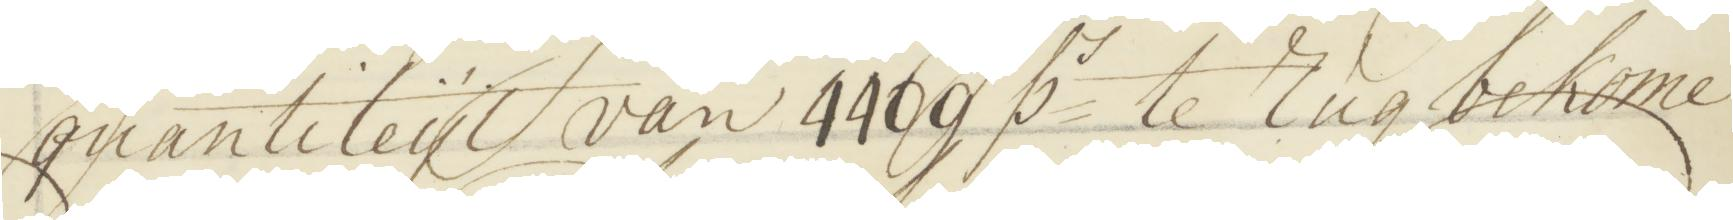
quantiteijt van 4469 p=s te Rug bekome
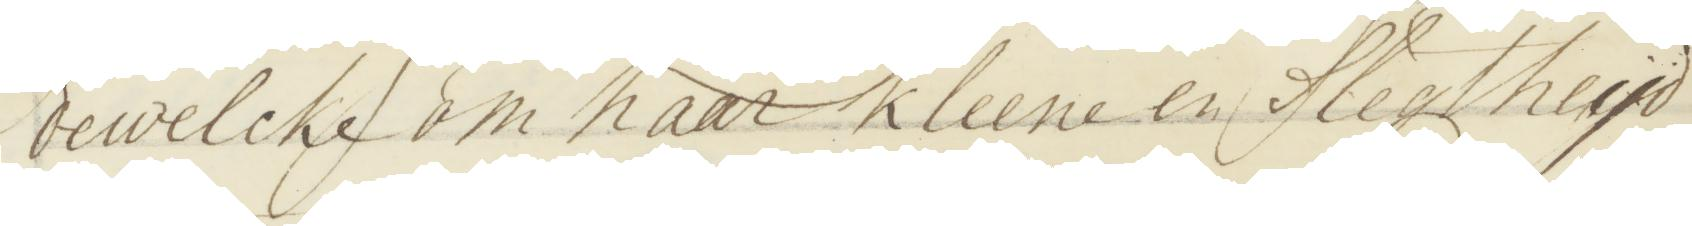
dewelcke om haar kleene en slegtheijd
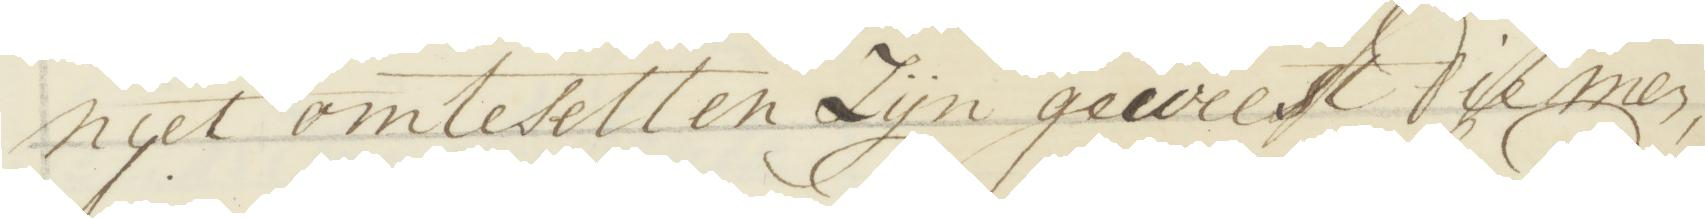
niet omtesetten zijn geweest die men
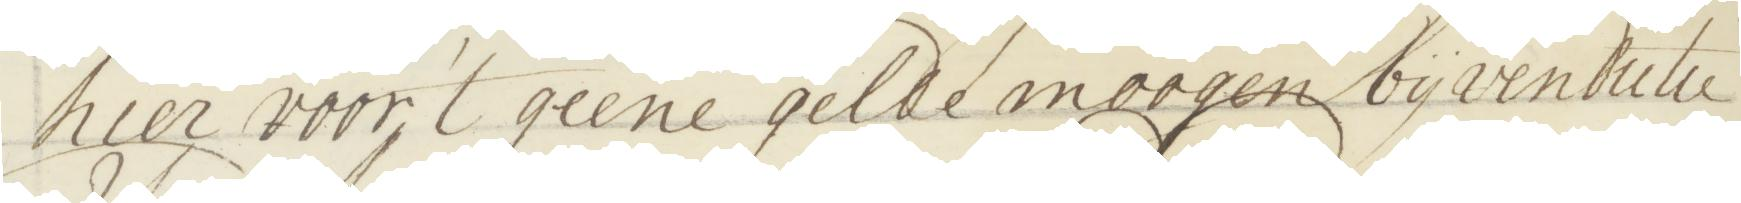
hier voor ’t geene gelde moogen bij vendutie
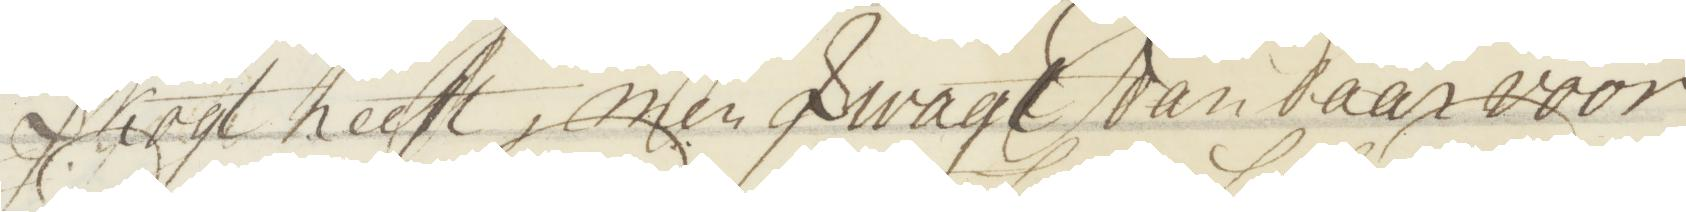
verkogt heeft, men verwagt dan daar voor
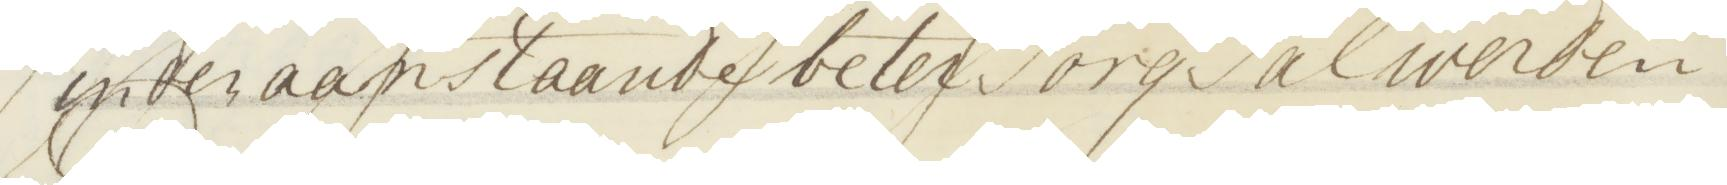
in den aanstaande beter sorg sal werden
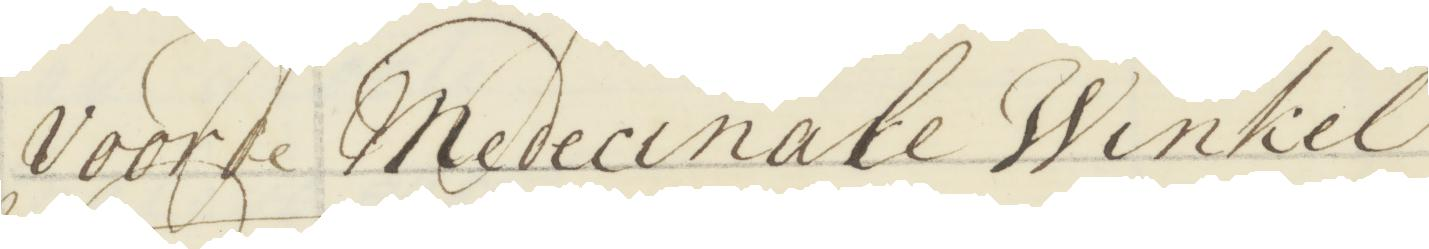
voorde Medecinale Winkel
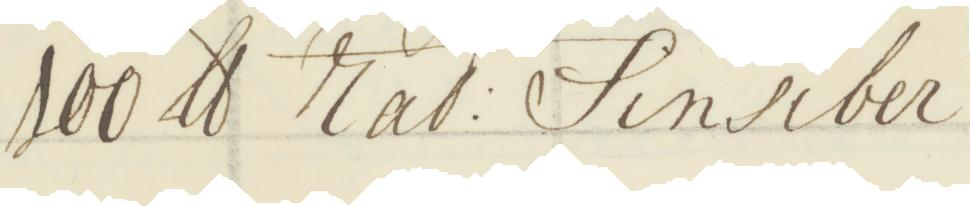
100 lb rad: sinsiber
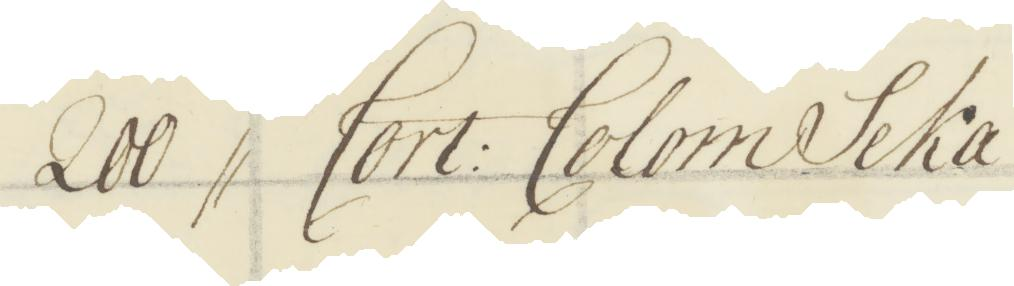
200 „ Cort: Colom seka
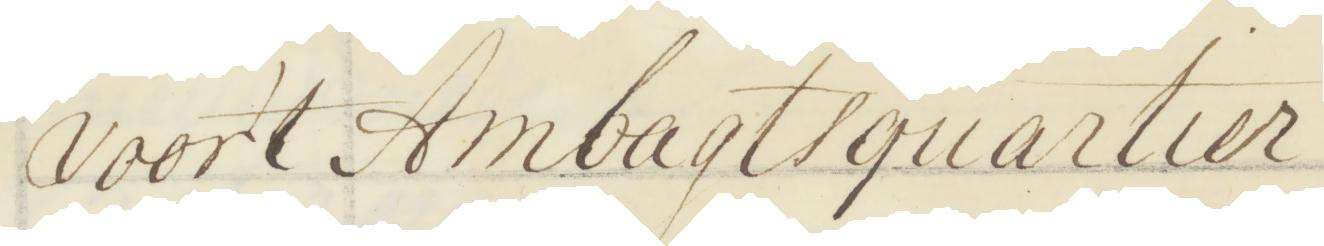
voor't Ambagtsquartier
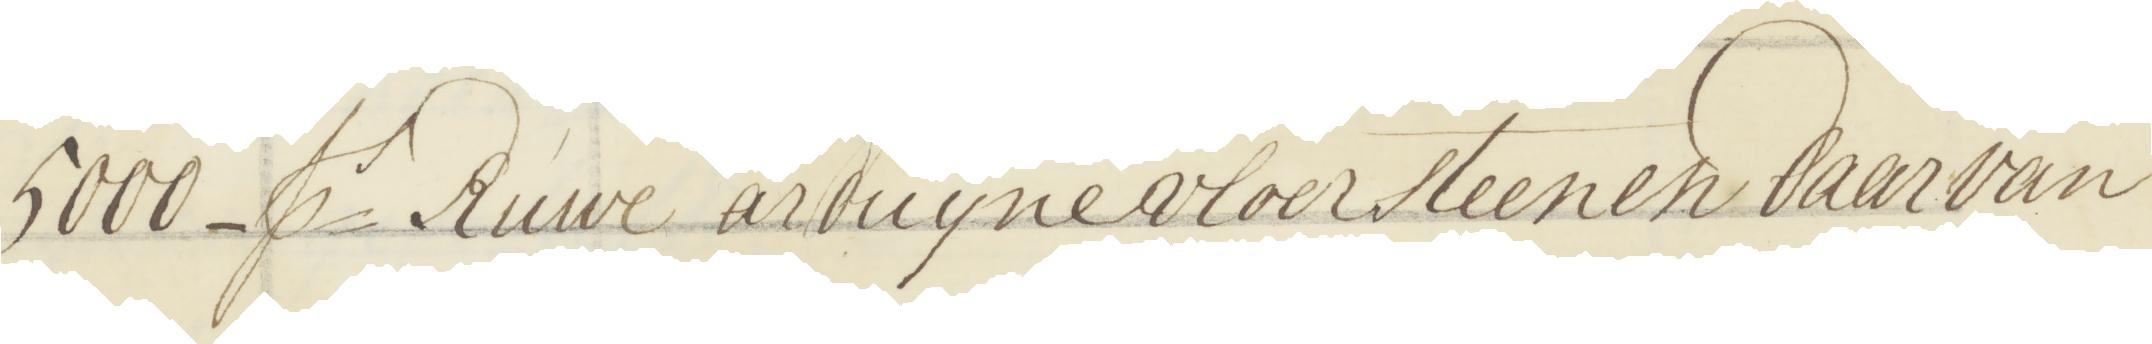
5000 — p=s Ruwe arduijnevloersteenen daar van
